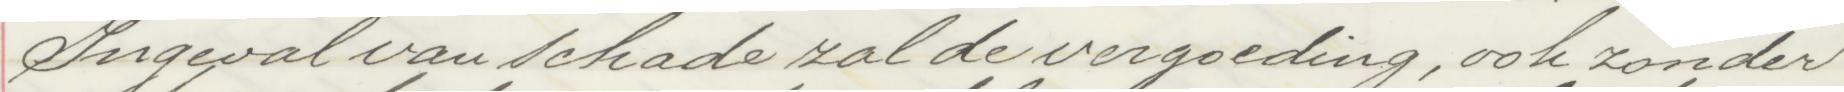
Ingeval van schade zal de vergoeding, ook zonder
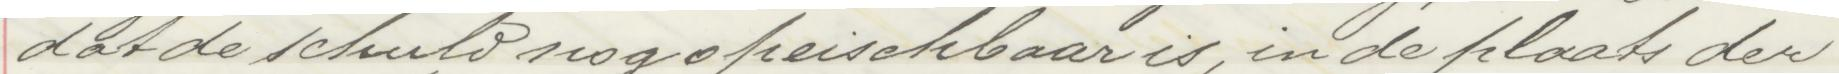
dat de schuld nog opeischbaar is, in de plaats der
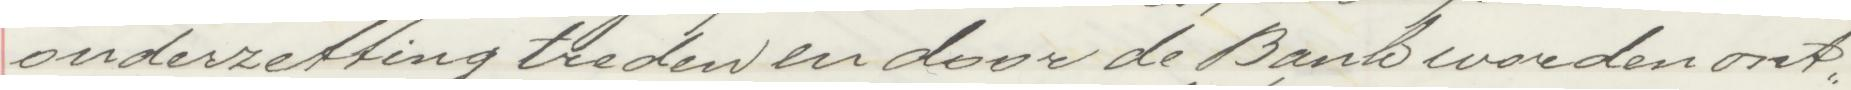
onderzetting treden en door de Bank worden ont„
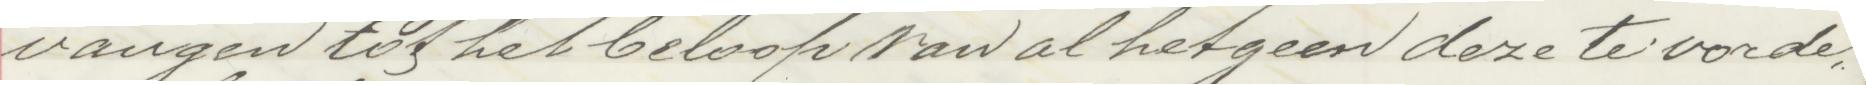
vangen tot het beloop van al het geen deze te vorde„
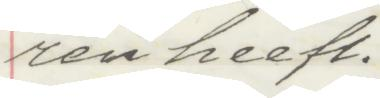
ren heeft.
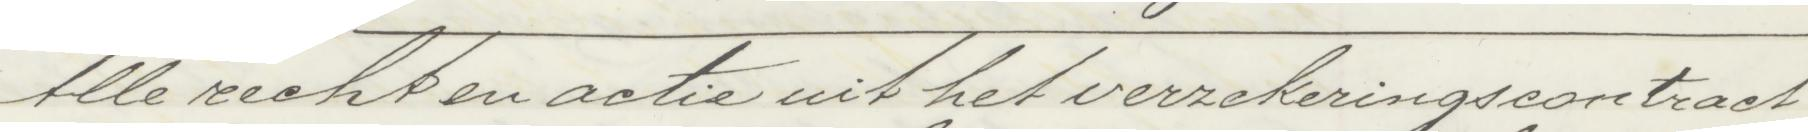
Alle recht en actie uit het verzekeringscontract
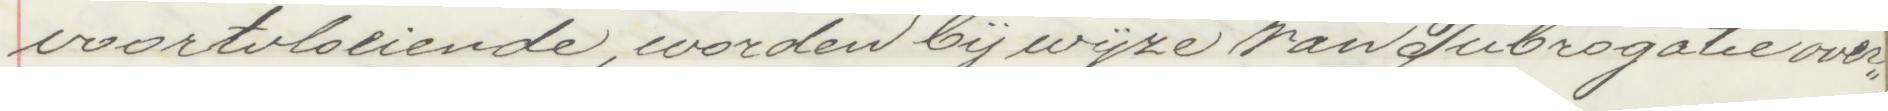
voortvloeiende, worden bij wijze van subrogatie over„
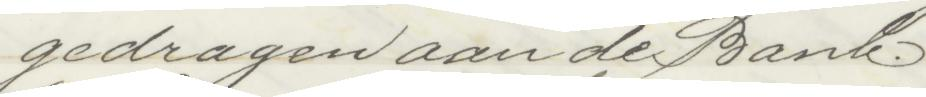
gedragen aan de Bank.
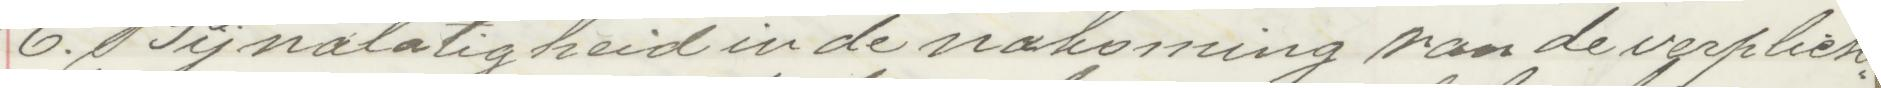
6. Bij nalatigheid in de nakoming van de verplich„
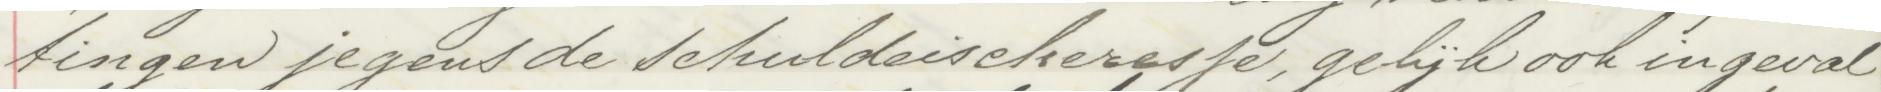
tingen jegens de schuldeischeresse, gelijk ook ingeval
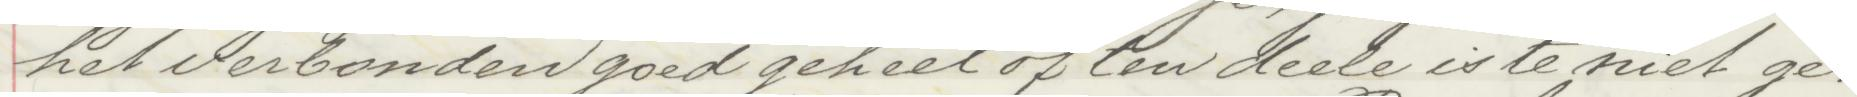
het verbonden goed geheel of ten deele is te niet ge„
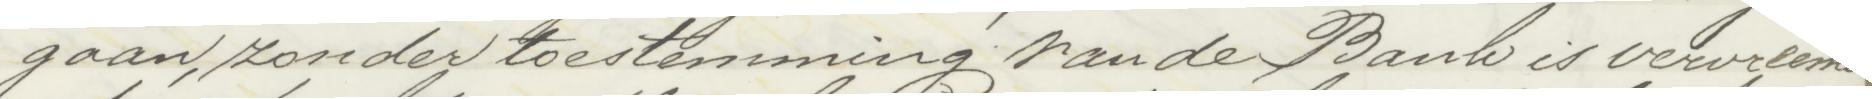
gaan, zonder toestemming van de Bank is vervreemd
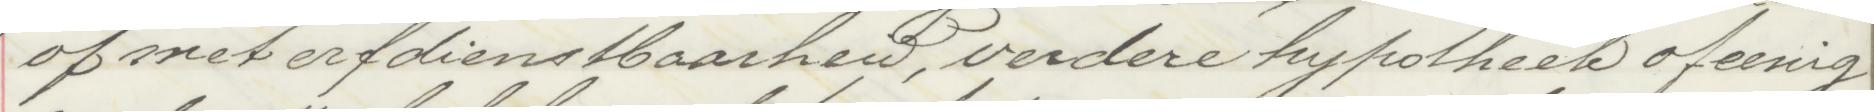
of met erfdienstbaarheid, verdere hypotheek of eenig
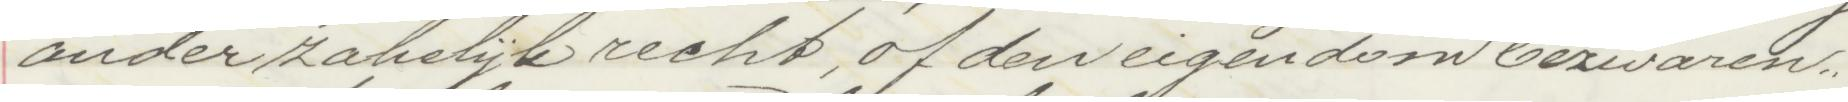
ander zakelijk recht, of den eigendom bezwaren„
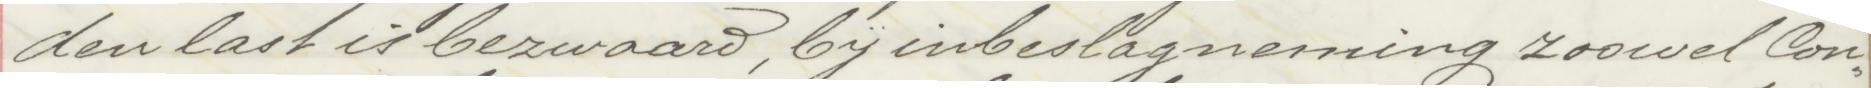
den last is bezwaard, bij inbeslagneming zoowel Con„
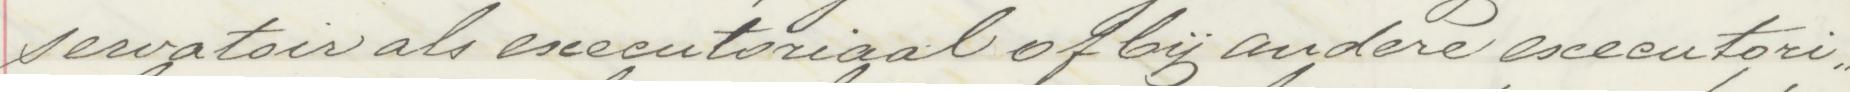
servatoir als executoriaal of bij andere executori„
